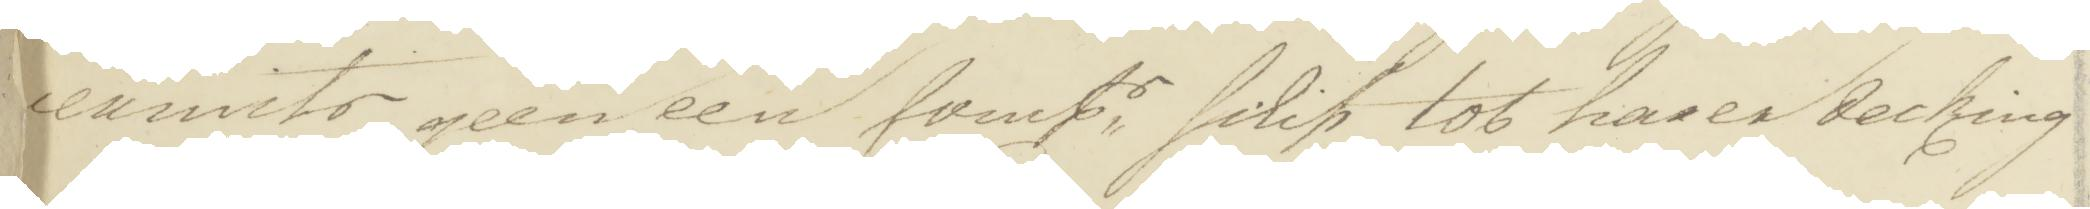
ermits geen een Comp„s schip tot harer decking
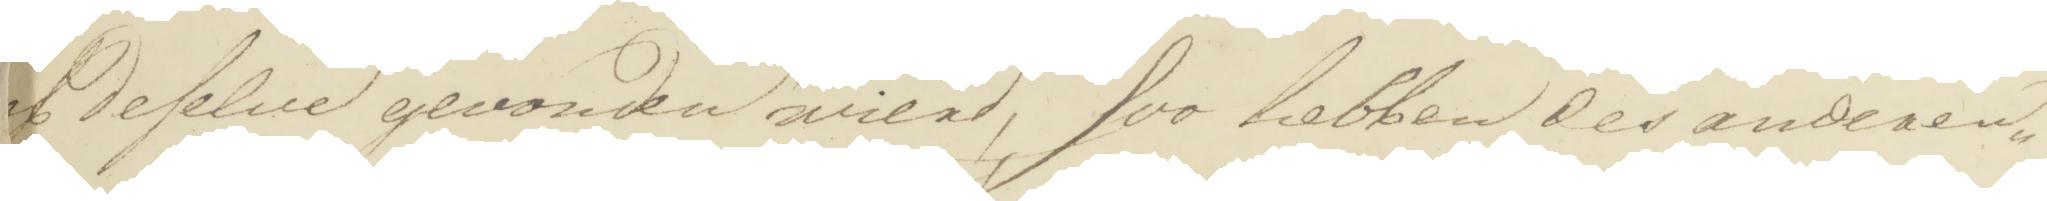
f deselve gevonden wierd, soo hebben des anderen„
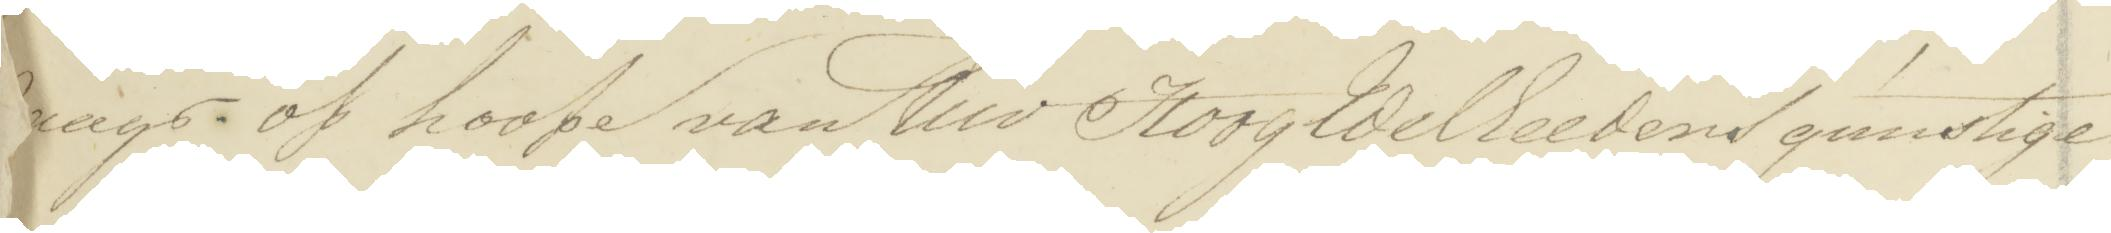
ags op hoope van uw Hoog Edelheedens gunstige
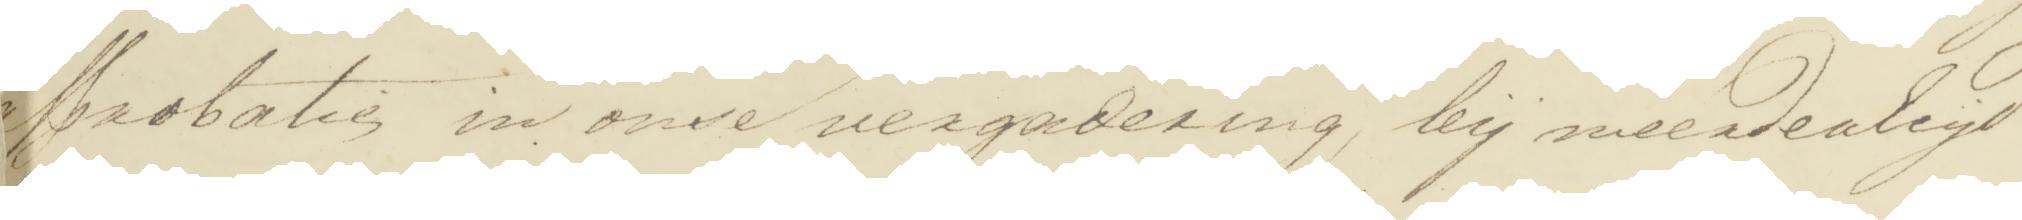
probatien in onse vergadering, bij meerderheijd
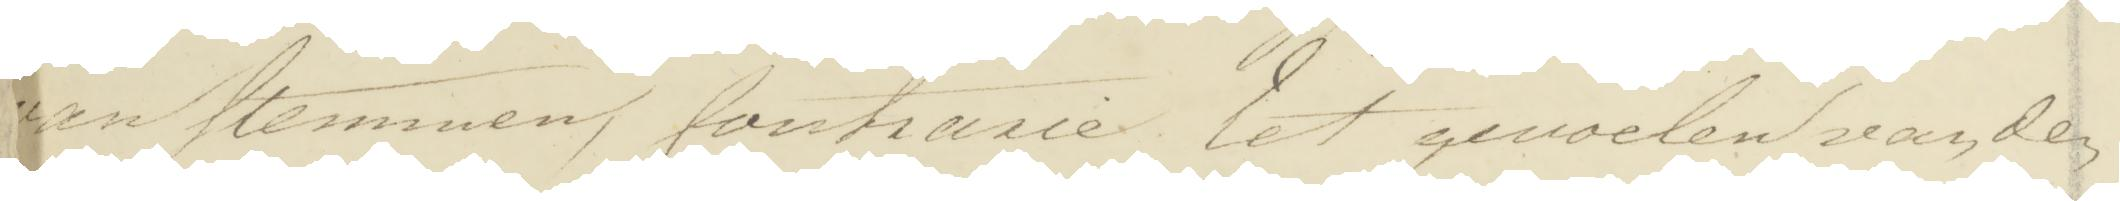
an stemmen, contrarie het gevoelen van den
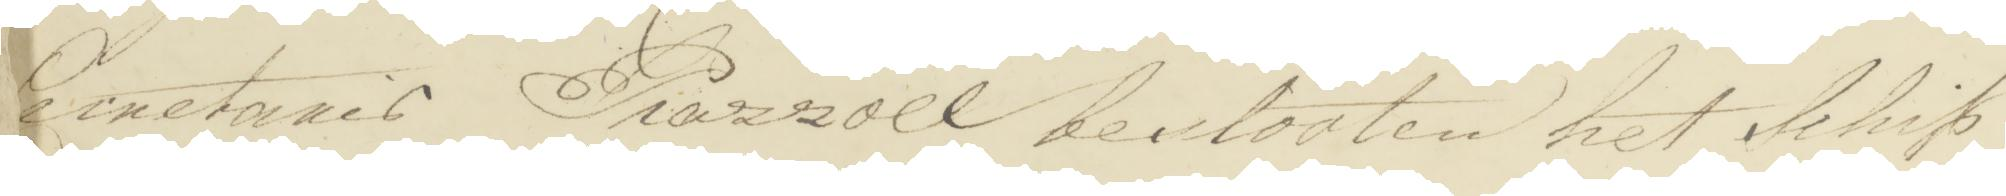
ecretaris Piazzoll beslooten het schip
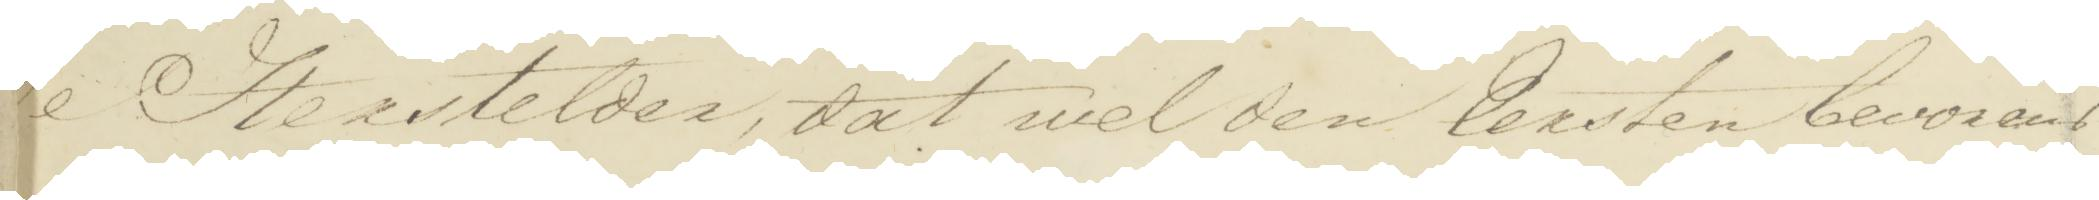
e Herstelder, dat wel den Eersten bevorens
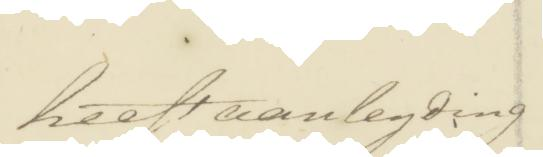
heeft aanleyding
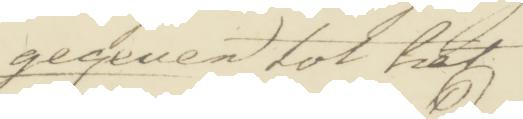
gegeven tot het
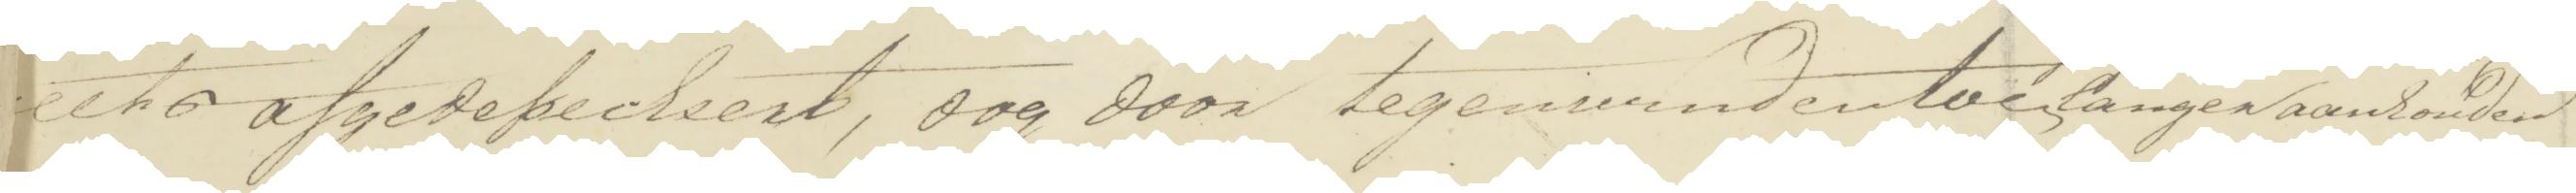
eets afgedepecheert, dog door tegenwinden toen langer aanhouden
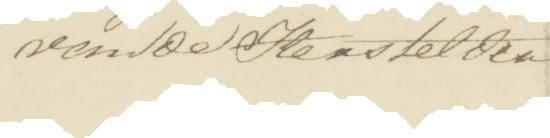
van de Herstelder
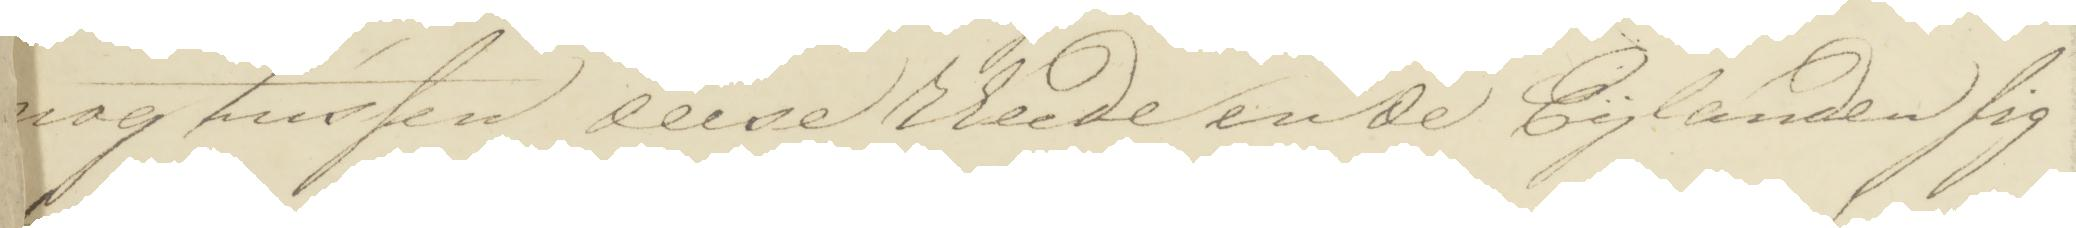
nog tussen deese rheede en de Eijlanden sig
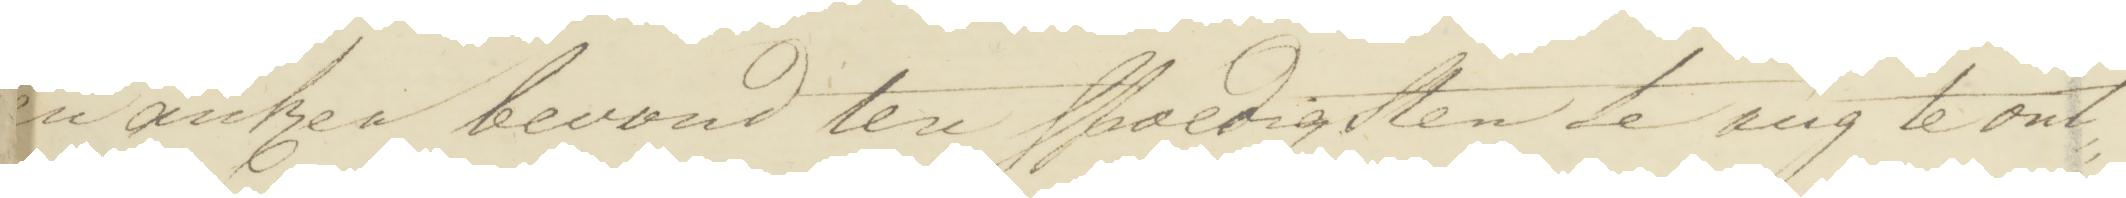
n anker bevond ten spoedigsten te rug te ont„
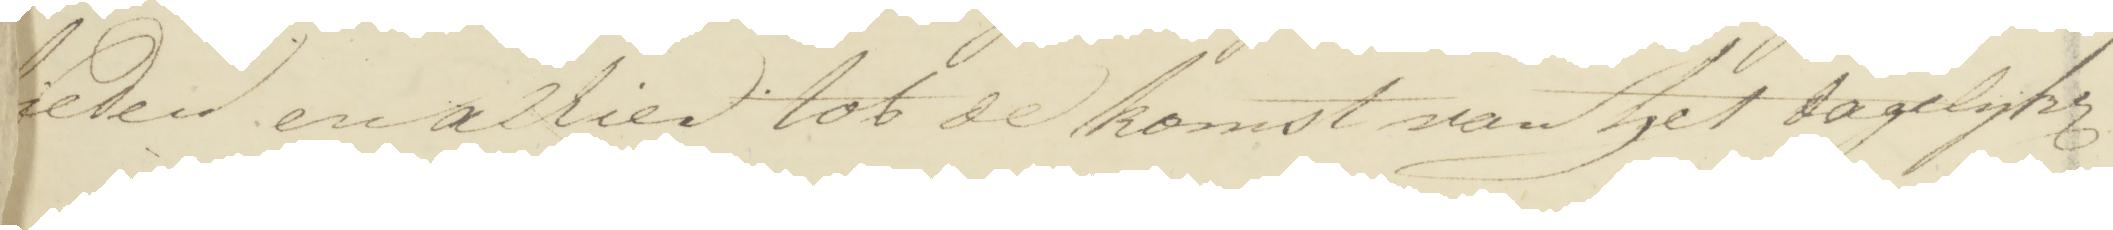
ieden en alhier tot de komst van het dagelijkz
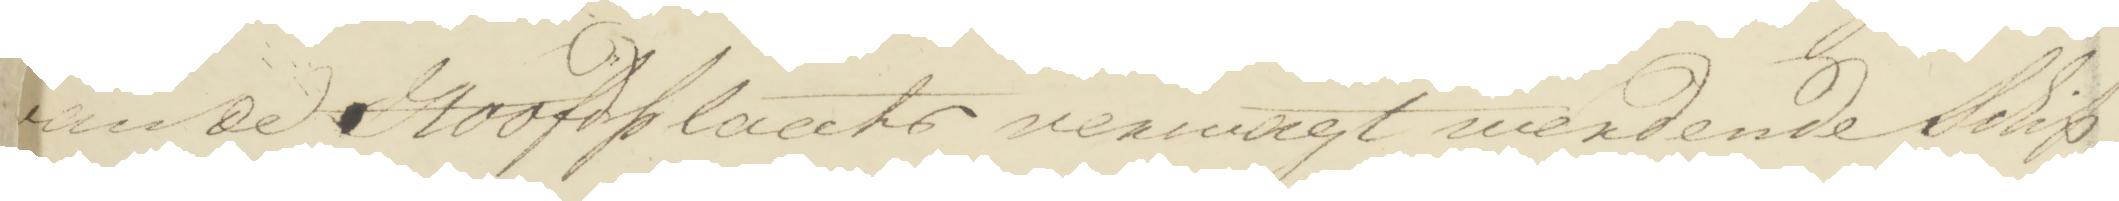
an de Hoofdplaats verwagt werdende schip
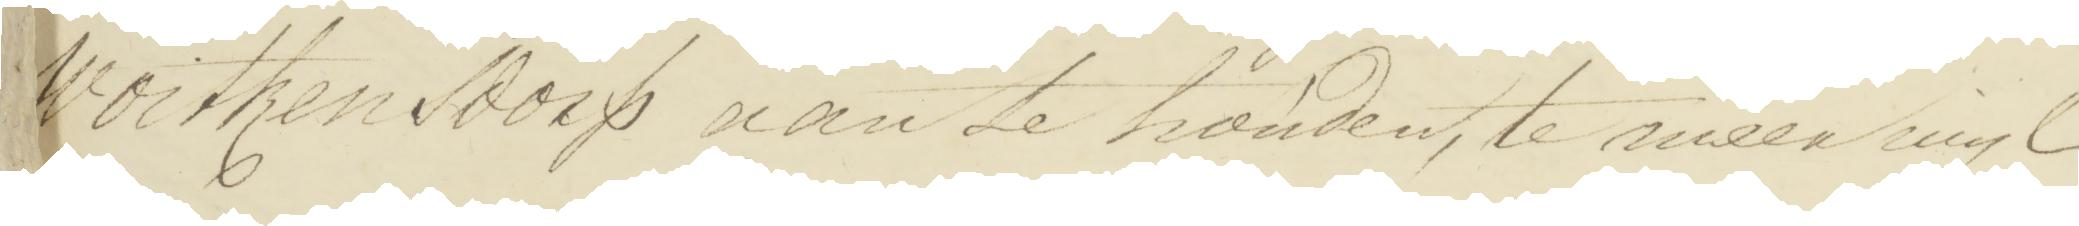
Woitkensdorp aan te houden, te meer wijl
